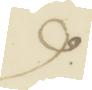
d.o
